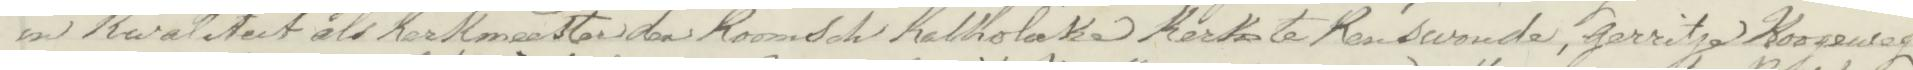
in kwaliteit als kerkmeester der Roomsch katholieke kerk te Renswoude, Gerritje Hoogeweg
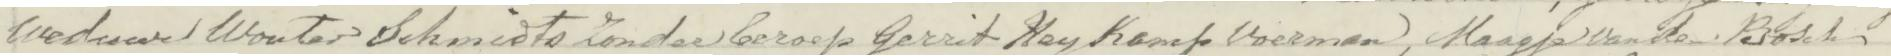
weduwe Wouter Schmidts zonder beroep Gerrit Heykamp Voerman, Maagje van den Bosch
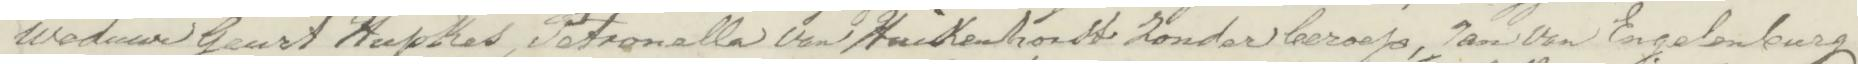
Weduwe Geurt Hupkes, Petronella van Huikenhorst zonder beroep Jan van Engelenburg
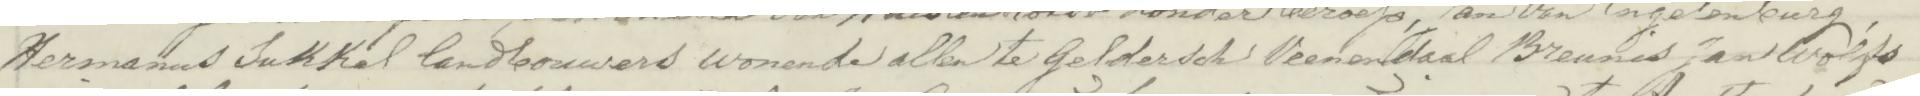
Hermanus Sukkel landhouwers wonende allen te Geldersch Veenendaal Breunis Jan Wolfs
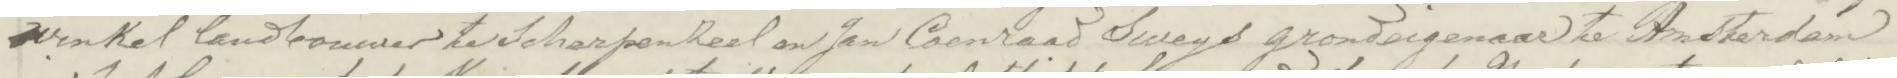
winkel landbouwer te Scherpenzeel en Jan Coenraad Sweys grondeigenaar te Amsterdam
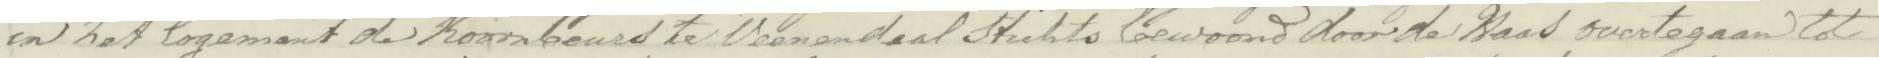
in het logement de Koornbeurs te Veenendaal Stichts bewoond door de Haas overtegaan tot
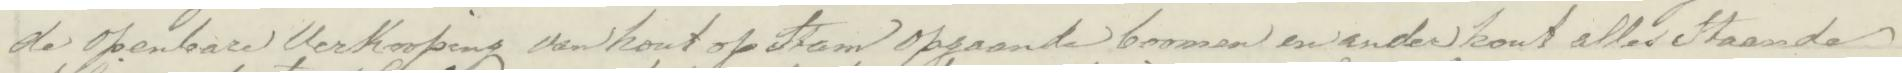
de Openbare Verkooping van hout op stam opgaande boomen en ander hout alles staande
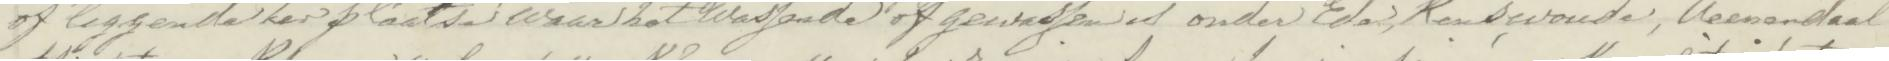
of liggende ter plaatse waar het wassende of gewassen is onder Ede, Renswoude, Veenendaal
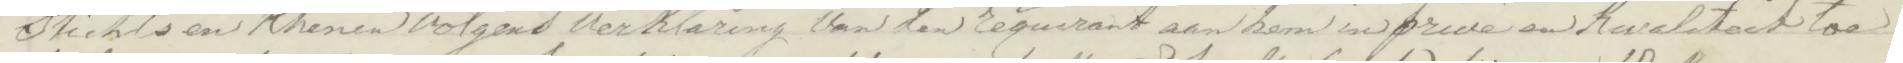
stichts en Rhenen volgens verklaring van den requirant aan hem in privé en kwaliteit toe
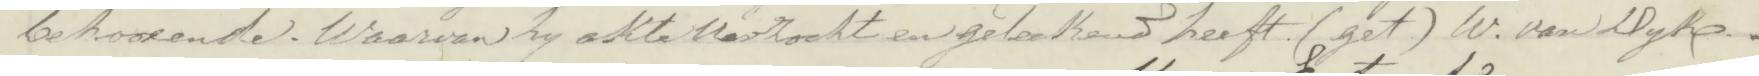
behoorende. Waarvan hij akte verzocht en geteekend heeft. (get) W. van Dijk
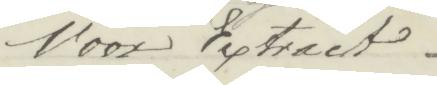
Voor Extract
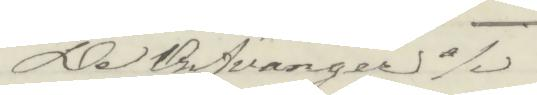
De Ontvanger a/i
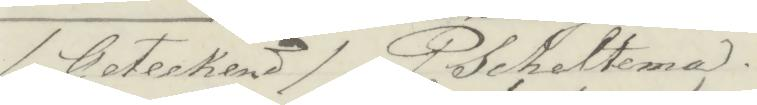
/ Geteekend / P Scheltema.
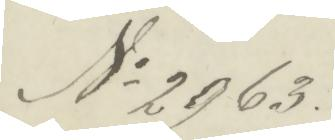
N=o 2963.
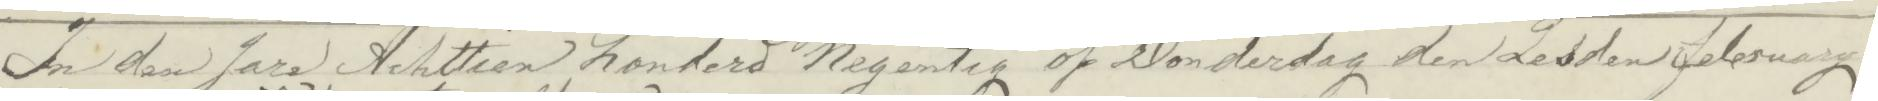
In dan Jare Achttien honderd Negentig op Donderdag den Zesden February
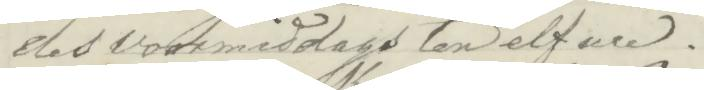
des voormiddags ten elf ure.
